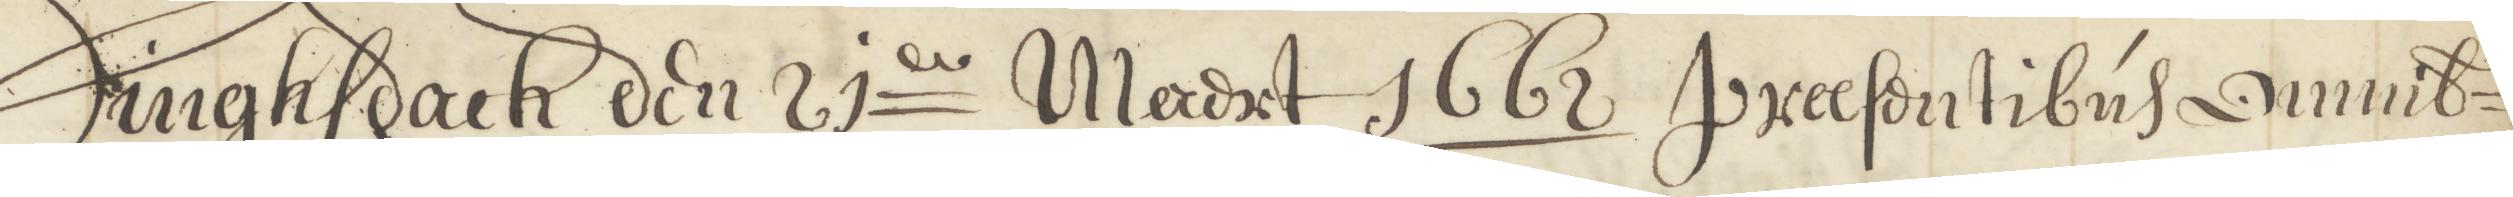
Dinghsdach den 21=en Maert 1662 Preesentibus Omnib=s
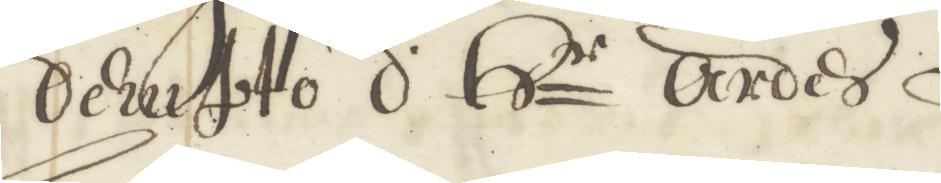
dempto d’ H=r ardes
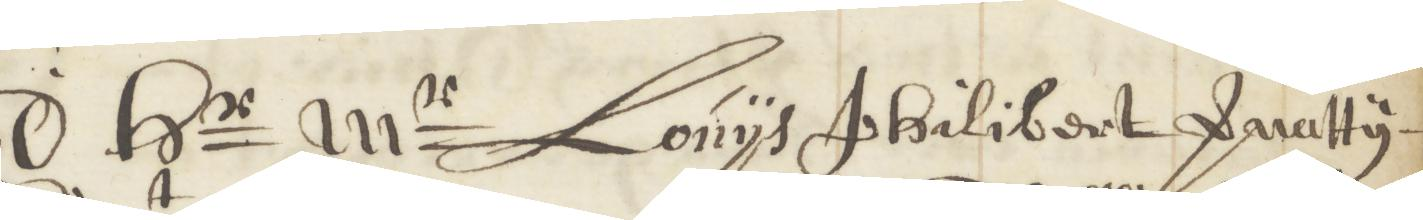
d H=r M=r Louijs philibert vernattij
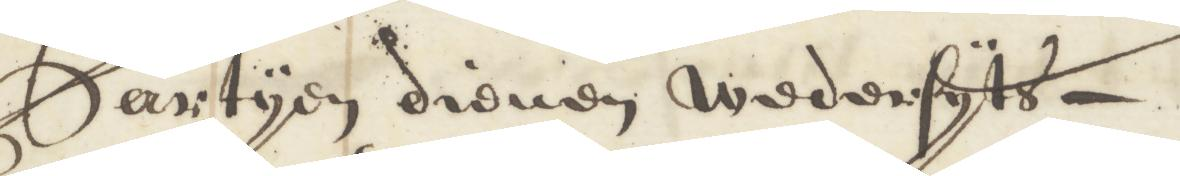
Partijen dienen wedersijts—
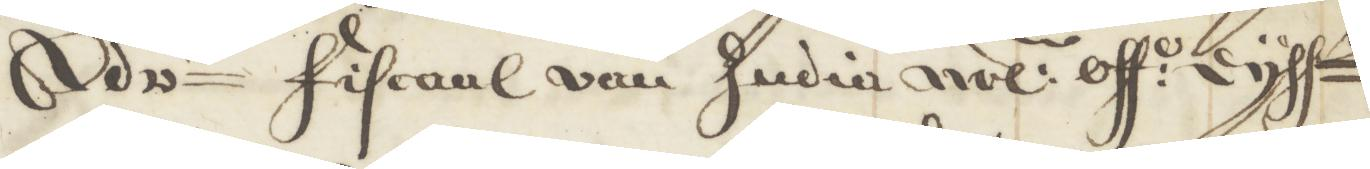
Adv=t fiscaal van Jndia wl: off:e Eijss=r
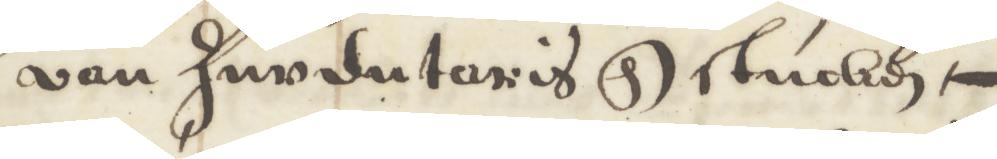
van Jnventaris stucken,-
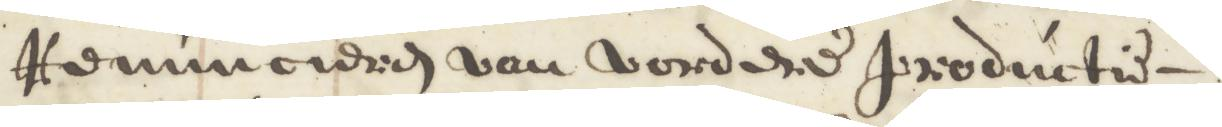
renuncieren van vordere productie—
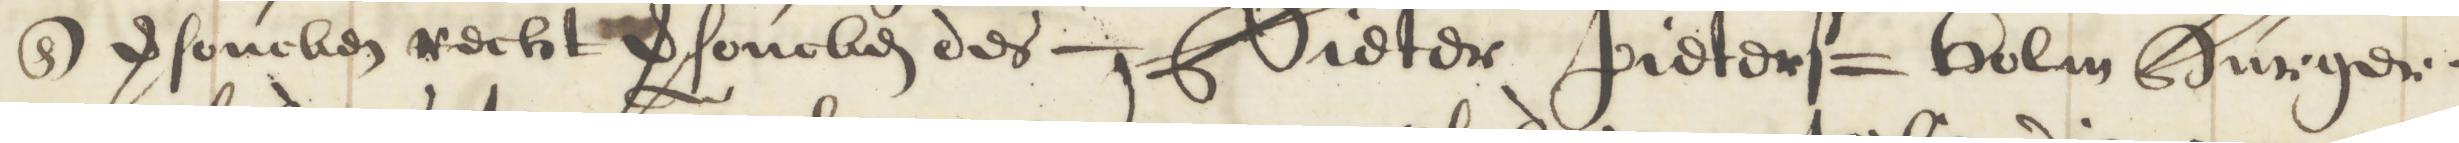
ende versoucken recht versoucken des — Pieter Pieters=n holm Burger
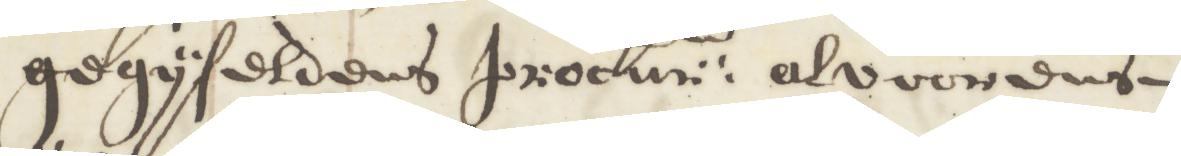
gegijseldens procur: alvoorens-
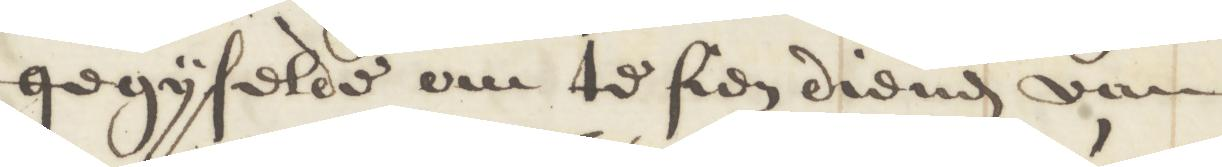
gegijselde om te sien dienen van
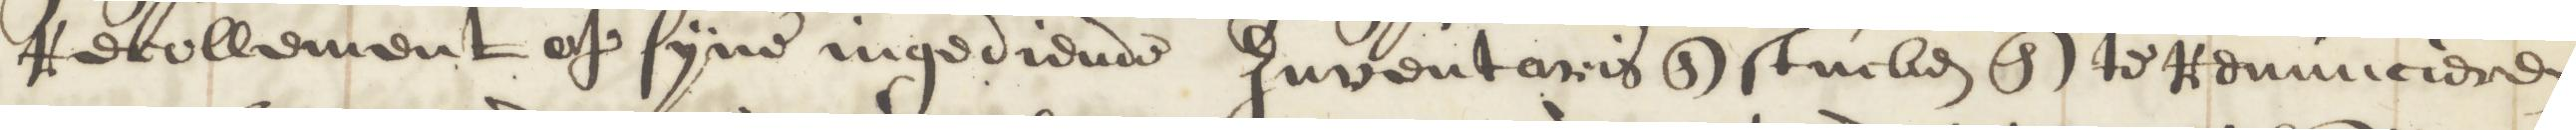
recollement op sijne ingediende Jnventaris ende stucken te renuncieren
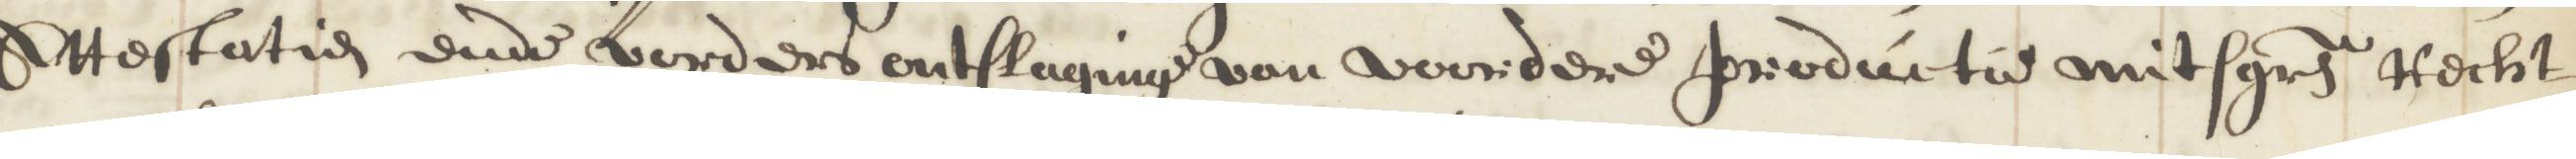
Attestatien ende verders ontslaginge van voordere productie mitsgrs recht
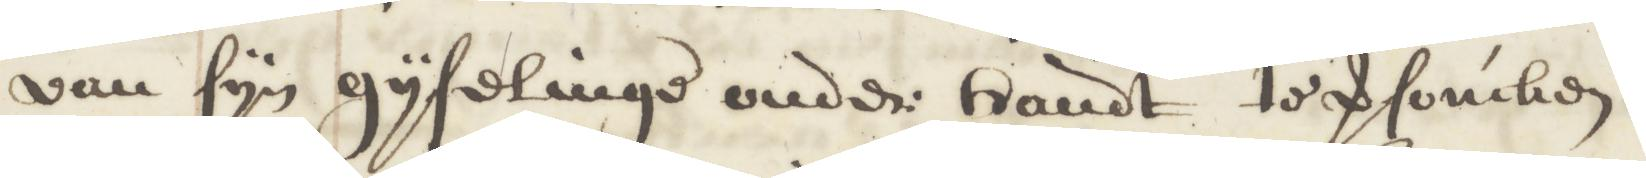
van sijn gijselinge onder handt te versoucken
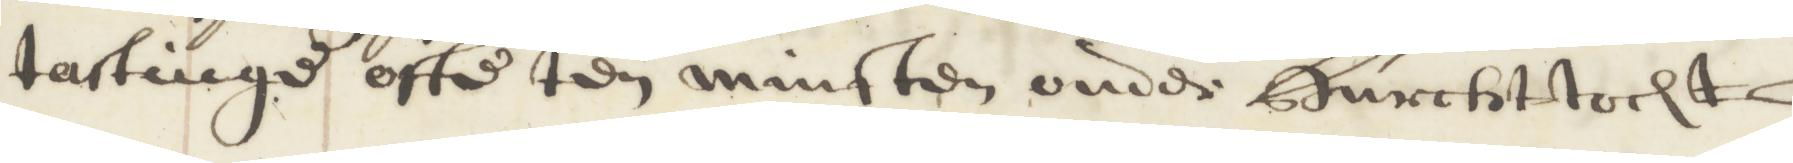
tastinge ofte ten minsten onder Burchttocht
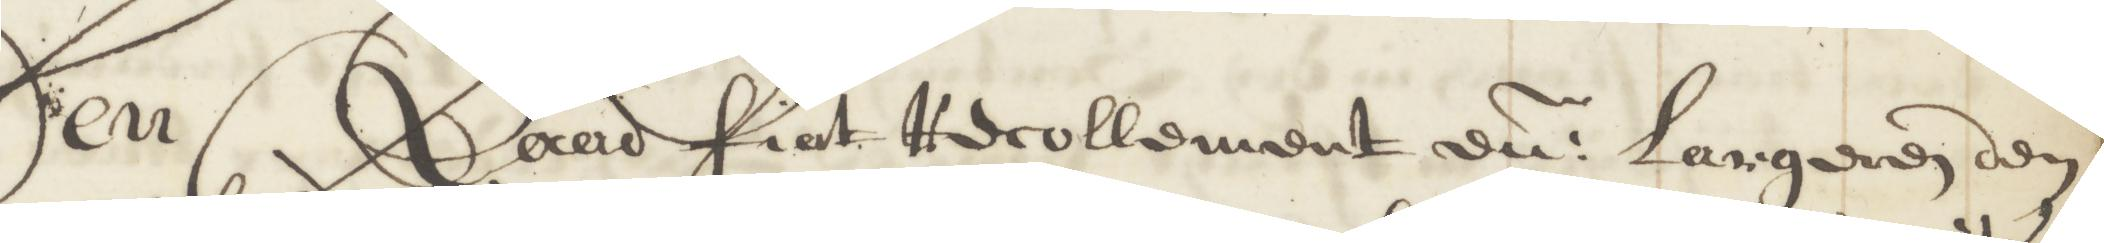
Den Raad fiat recollement en: largeren den
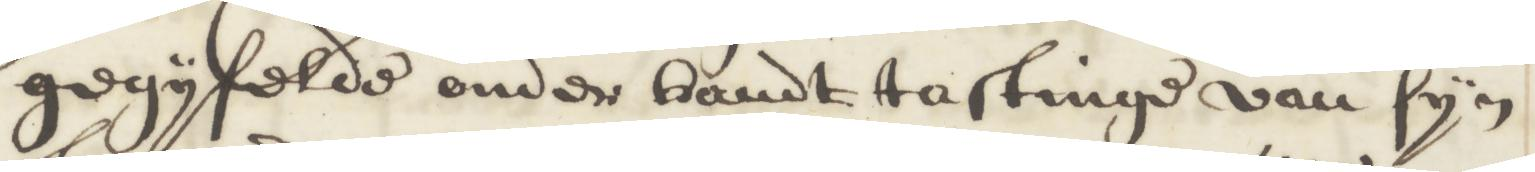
gegijselde onder handt tastinge van sijn
